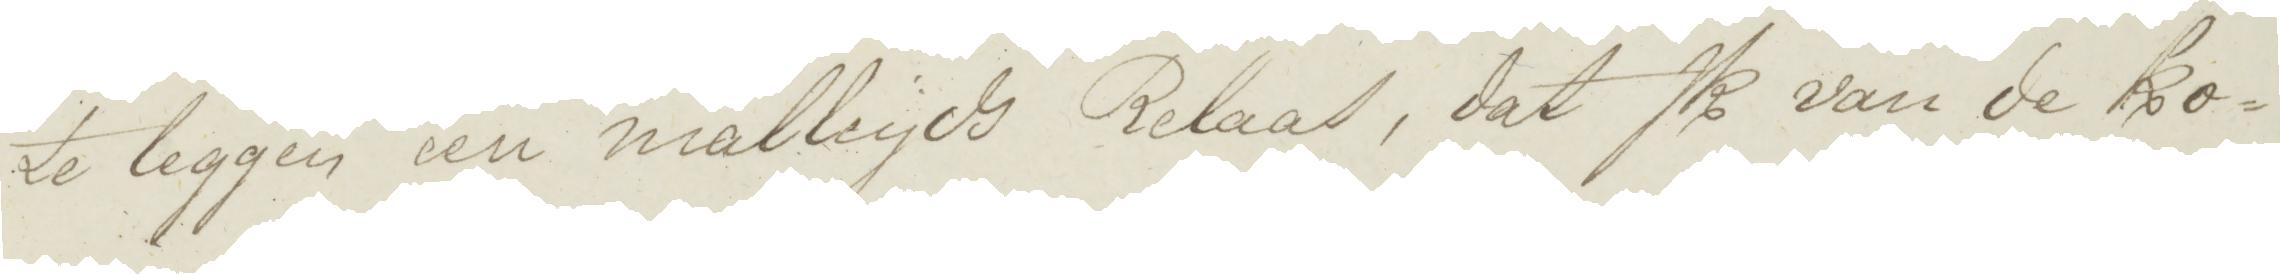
te leggen een malleijch Relaas, dat jk van de ko=
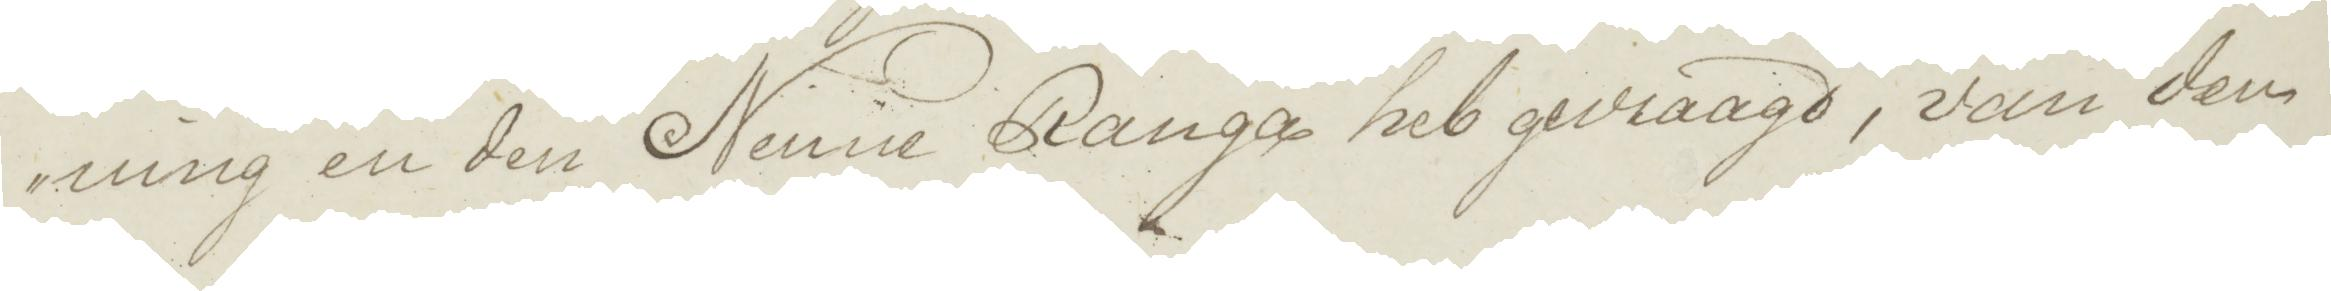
„ning en den Neinie Ranga heb gevraagd, van den
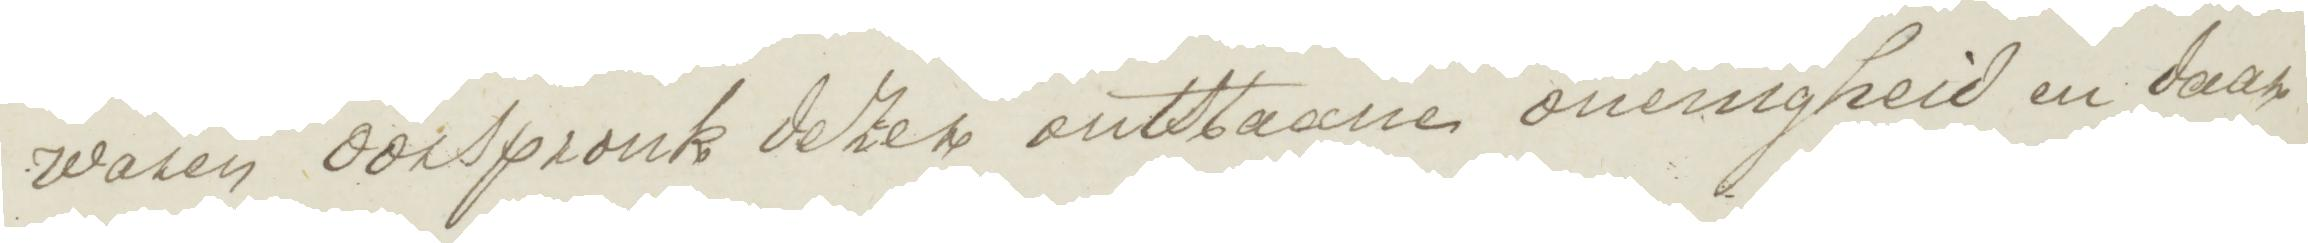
waren oorspronk dezer ontstaane onenigheid en daar
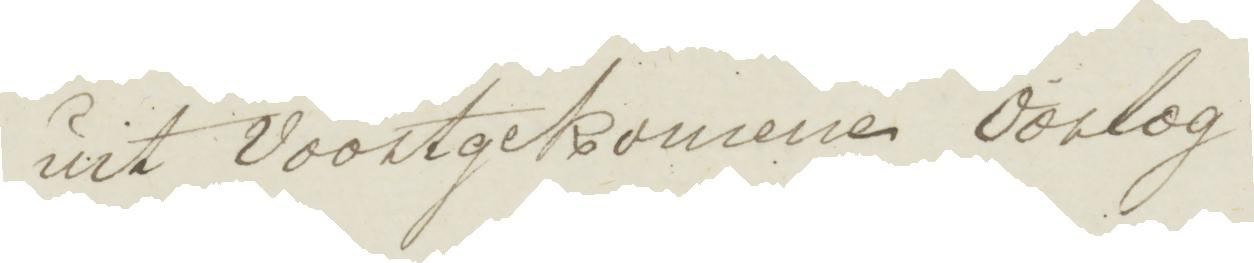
uit voortgekomene Oorlog.
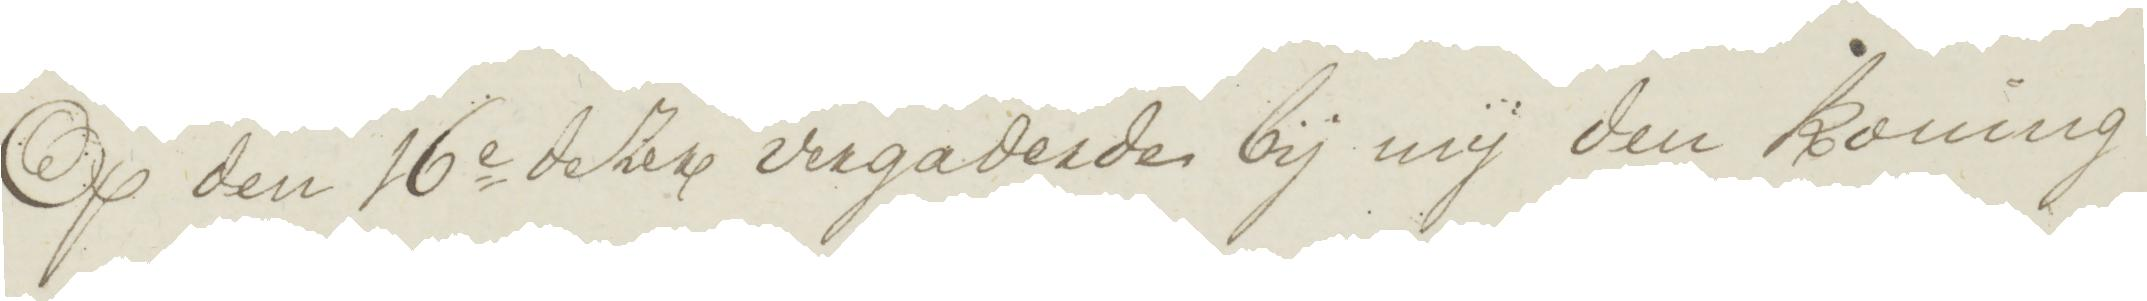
Op den 16=e dezer vergaderde bij mij den koning
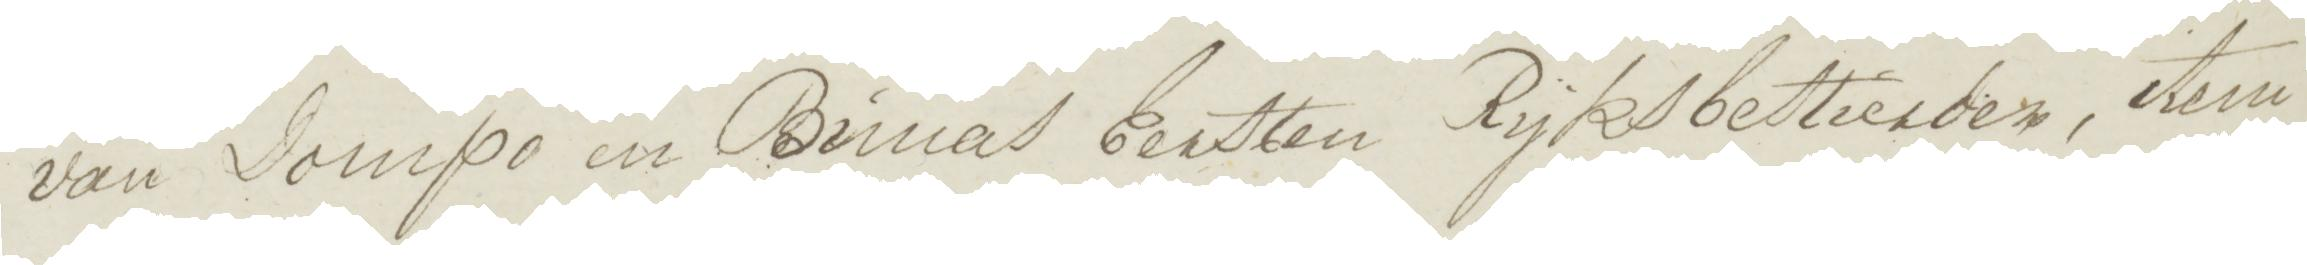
van Dompo en Bimas Eersten Rijksbestierder, item
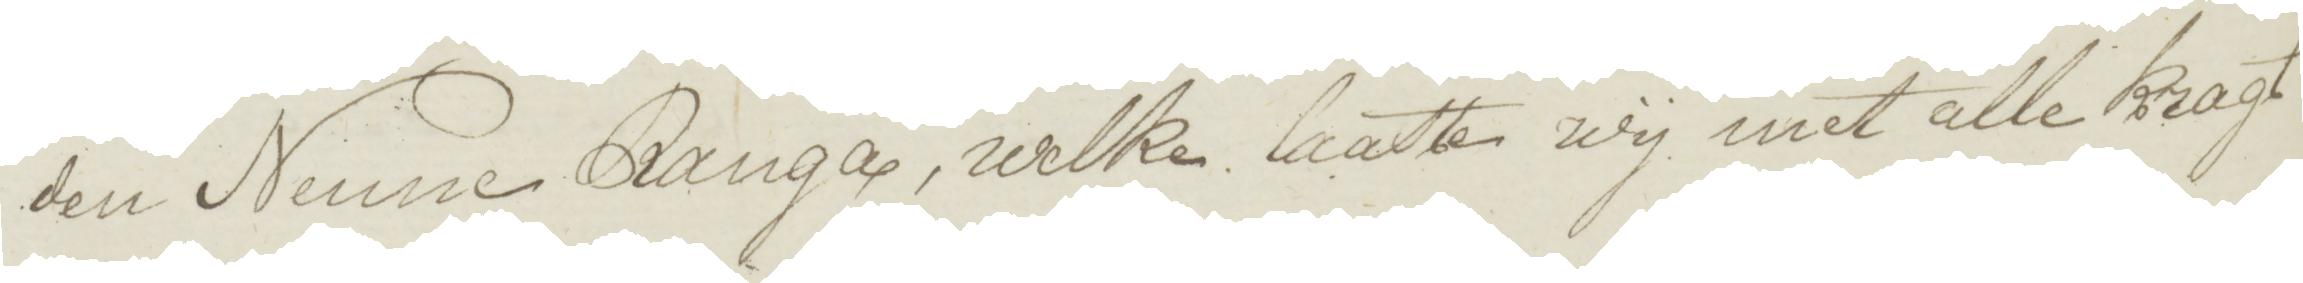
den Neinie Ranga, welke laaste wij met alle kragt
